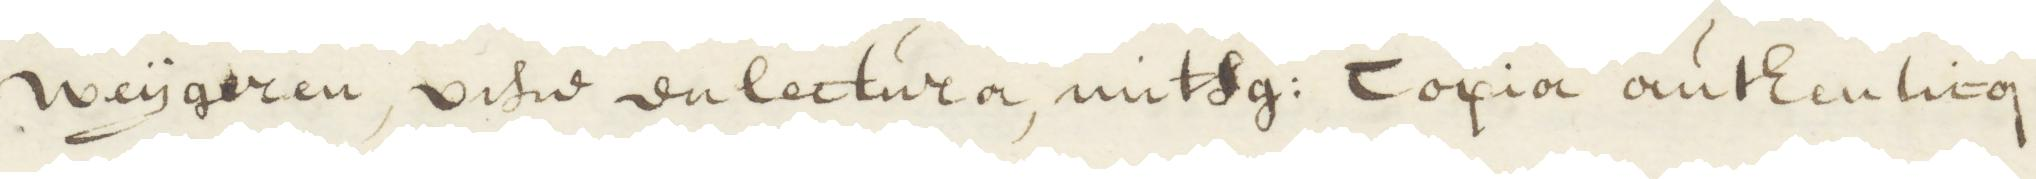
weijgeren, visie en lectura, mitsg:s Copia authenticq
